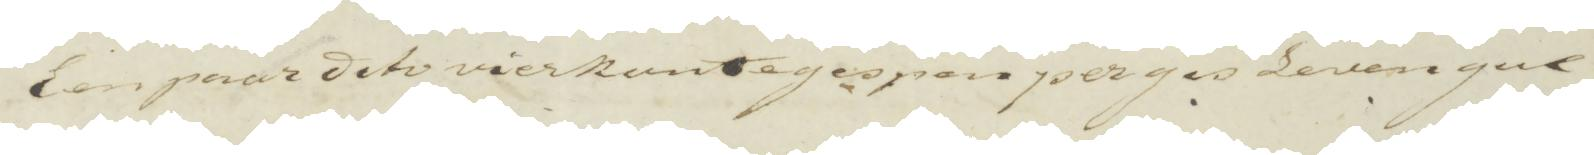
Een paar dito vierkante gespen per gis Zeven qul
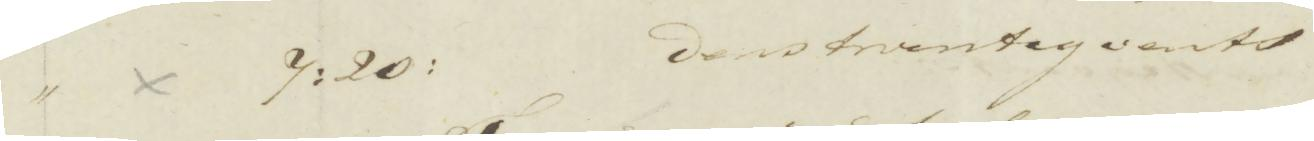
„ x 7: 20: dens twintig cents
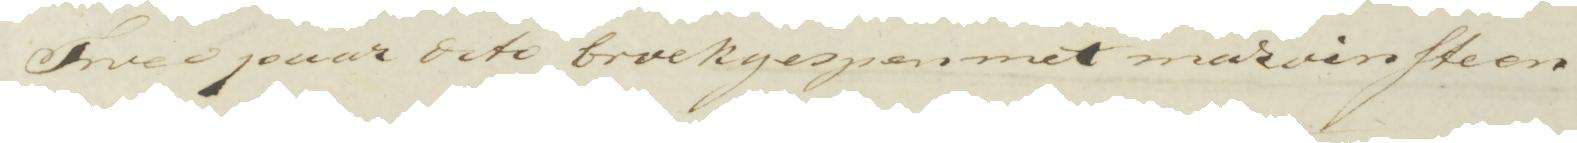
twee paar dito broekgespen met marain steen
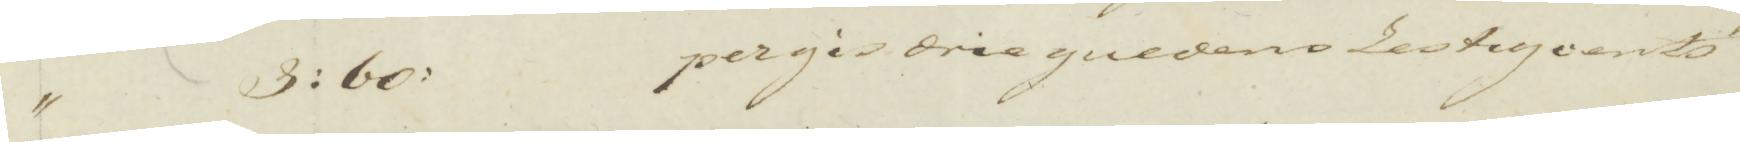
„ 3: 60: per gis drie guldens sestig cents
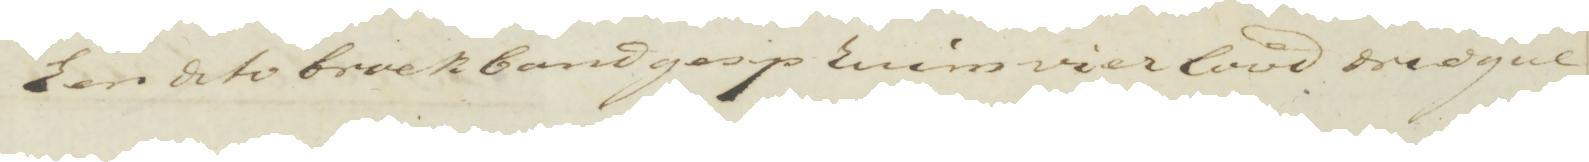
Een dito broekband gesp ruim vier lood drie gul
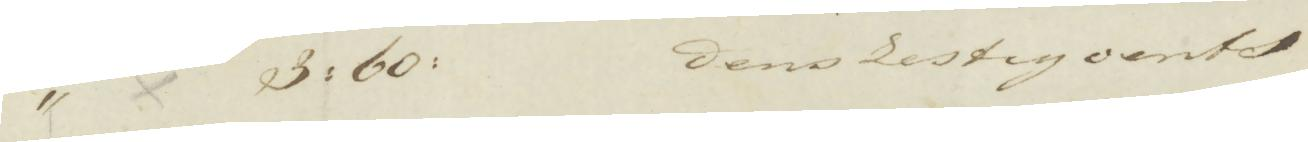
„ x 3: 60: dens zestig cents
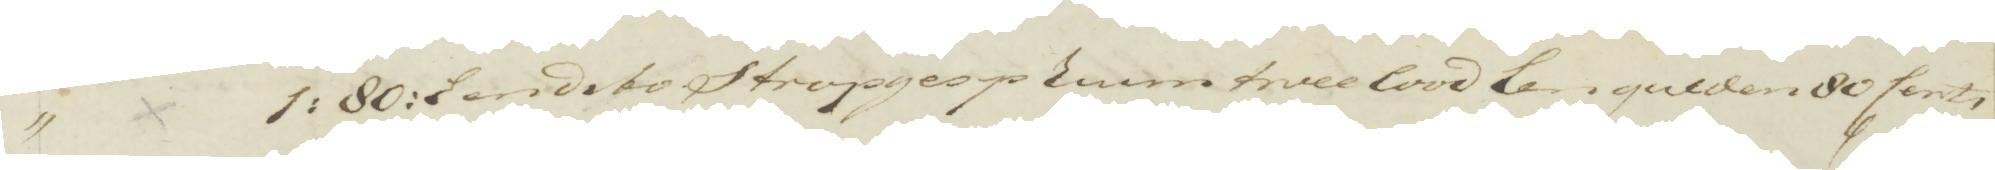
„ x 1: 80: Een dito Stropgesp ruim twee lood Een gulden 80 Cents
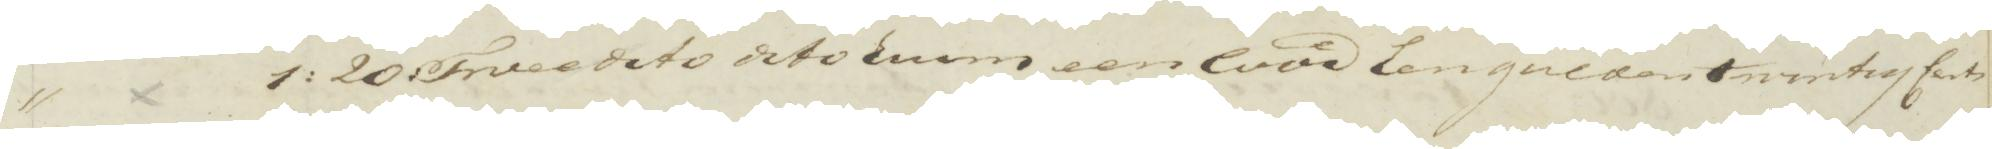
„ x 1: 20: Twee dito ruim een lood Een gulden twintig Cents
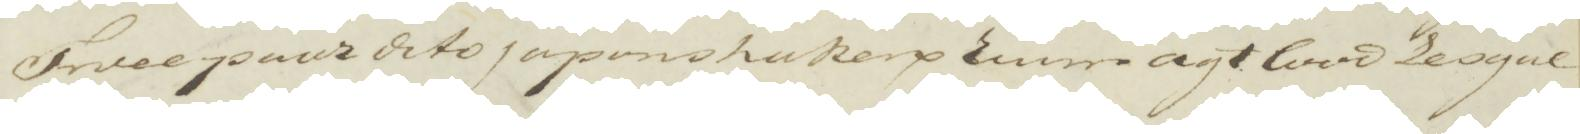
Twee paar dito japons haken ruim agt lood zes qul
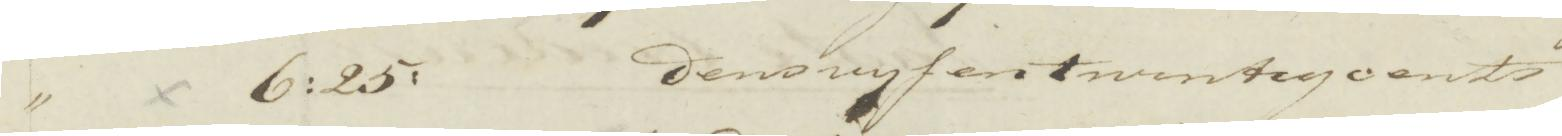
„ x 6: 25: dens vyf en twintig cents
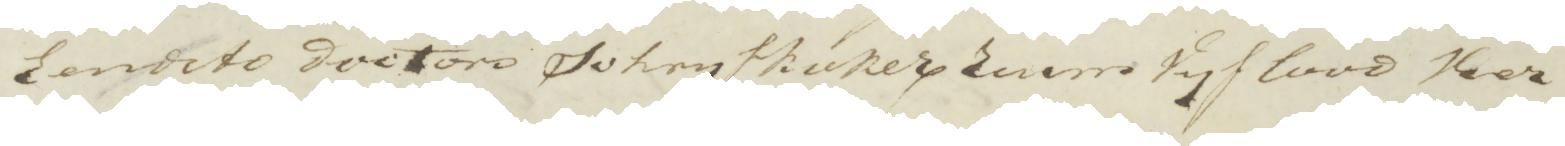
Een dito doctors schryfkoker ruim vyf lood vier
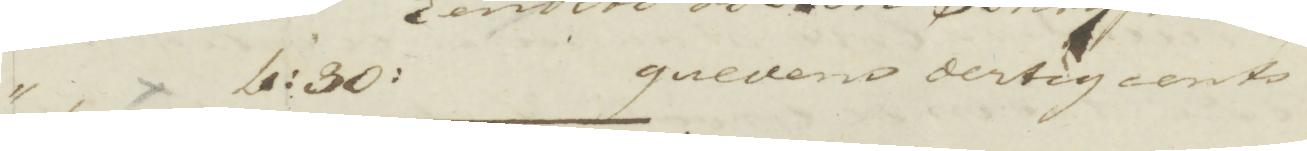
„ x 4: 30: guldens dertig cents
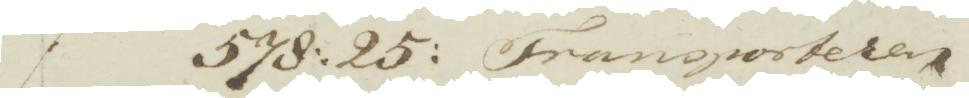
ƒ 578: 25: Transporteren
